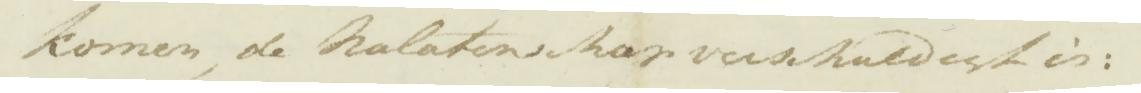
komen, de Nalatenschap verschuldigt is.
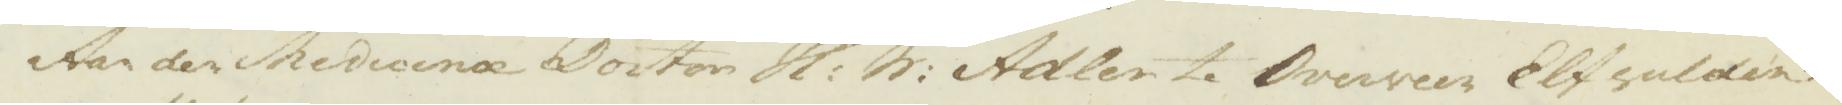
Aan den Medicinae Doctor H:W: Adler te Overveen Elf guldens
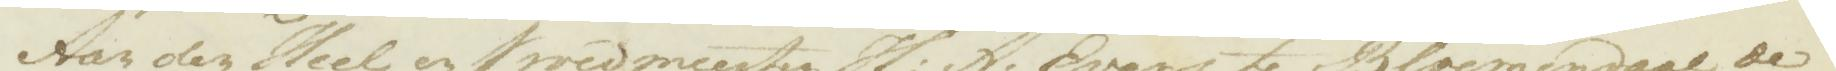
Aan den Heel en t wedmeeste H: A. Evers te Bloemendaal de
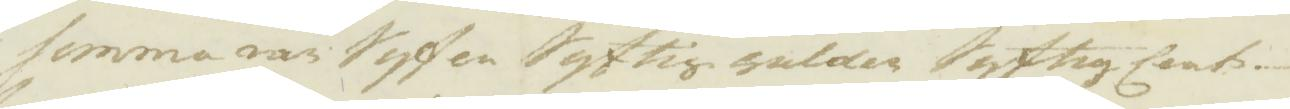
somma van Vyf en Vyftig gulden Vyftig Cent.
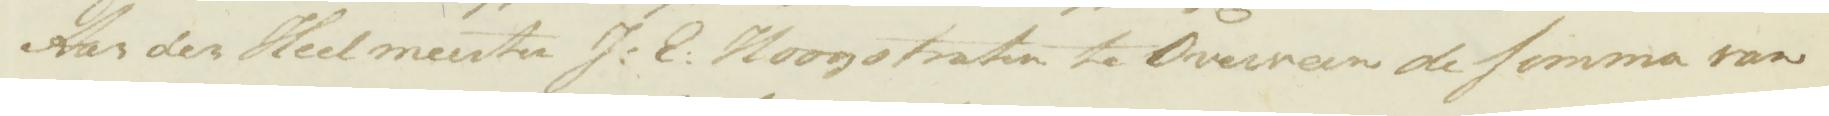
Aan der Heelmeester J: E: Hoogstraten te Overveen de somma van
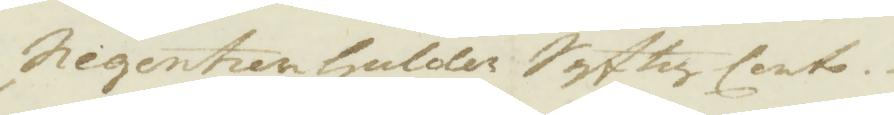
negentien Gulden Vyftig Cent.
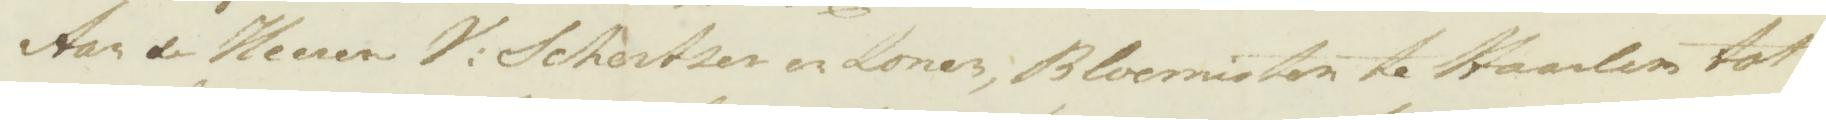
Aan de Heeren V: Schertzer en zonen, Bloemisten te Haarlem tot
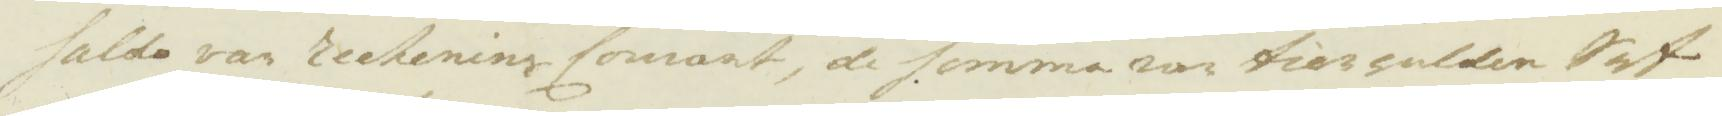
saldo van reekening Courant de somma van tien gulden Vyf
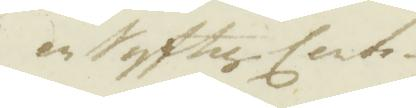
en Vyftig Cents.
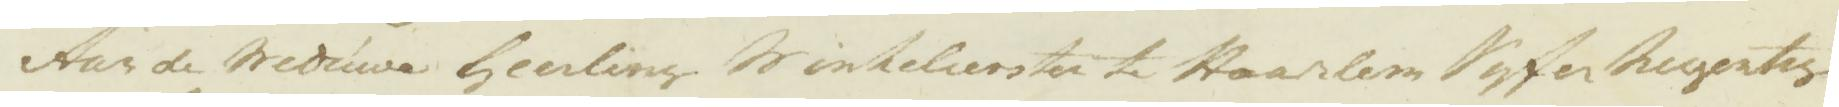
Aan de Weduwe Geerling Winkelierster te Haarlem Vyf en negentig
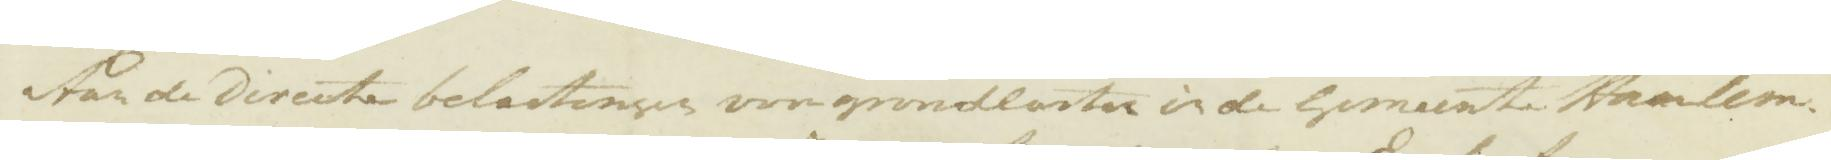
Aan de directe belastingen voor grondlasten in de Gemeente Haarlem.
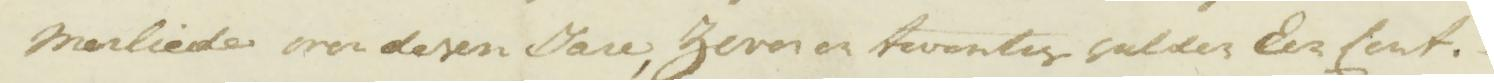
merlieden over dezen Jare, Zeven en twintig gulden Een Cent.-
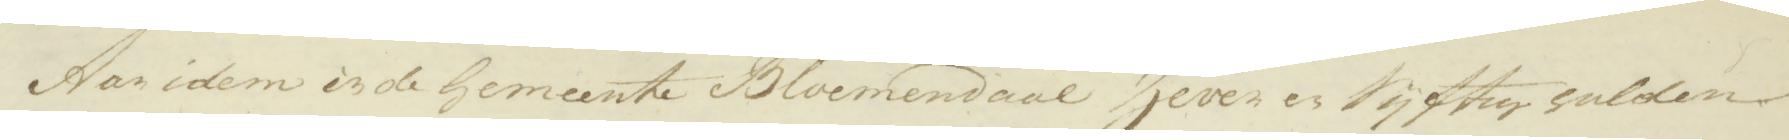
Aan idem in de Gemeente Bloemendaal Zeven en Vijftig gulden
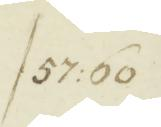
ƒ57:00
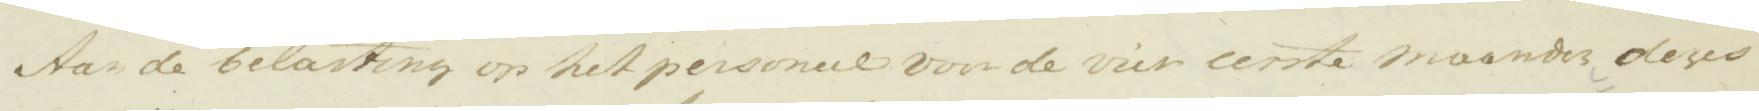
Aan de belasting op het personeel voor de vier eerste maanden dezes
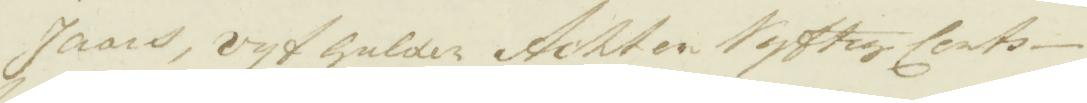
Jaars, vyf gulden Acht en Vyftig Cents. -
